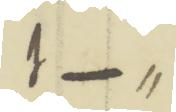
1 – „
